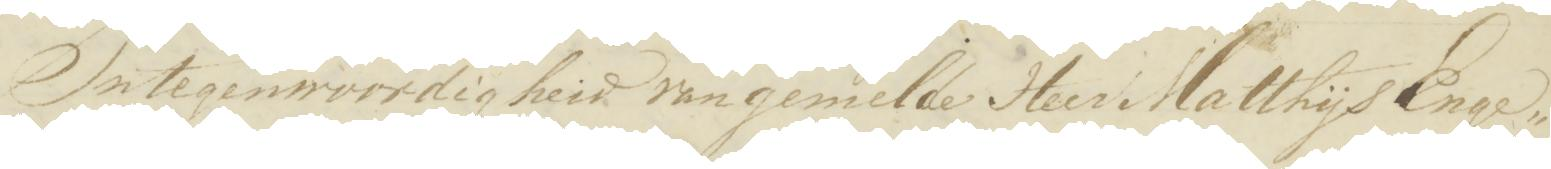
Jntegenwoordigheid van gemelde Heer Matthijs Enge„
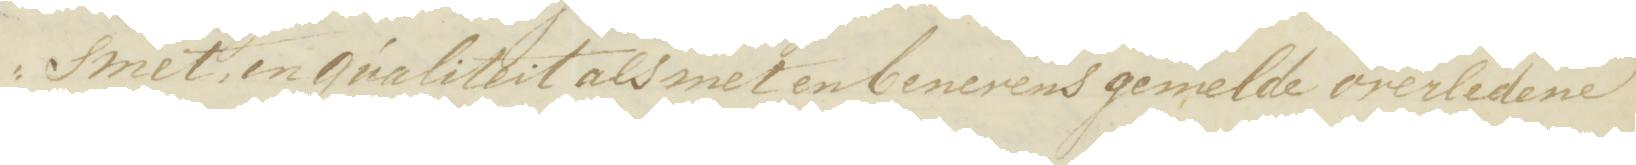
„smet en qualiteit als met en benevens gemelde overledene
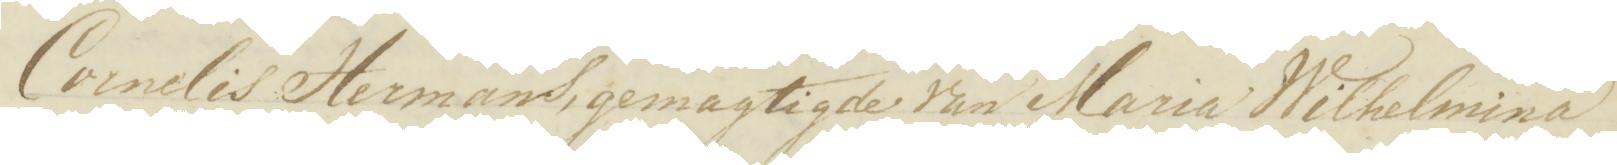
Cornelis Hermans, gemagtigde van Maria Wilhelmina
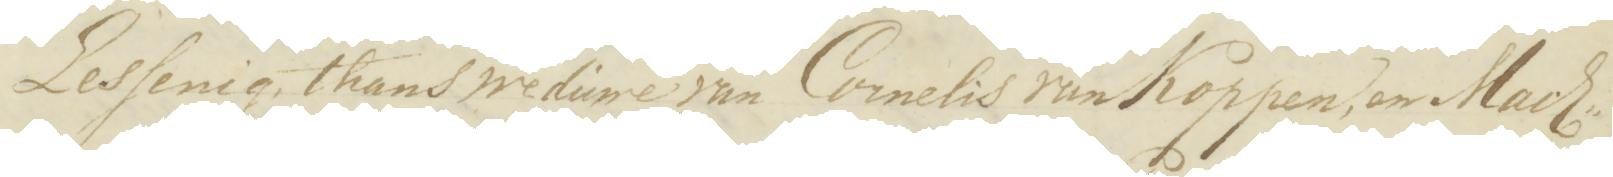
Lessenig, thans weduwe van Cornelis van Koppen, en Mach:
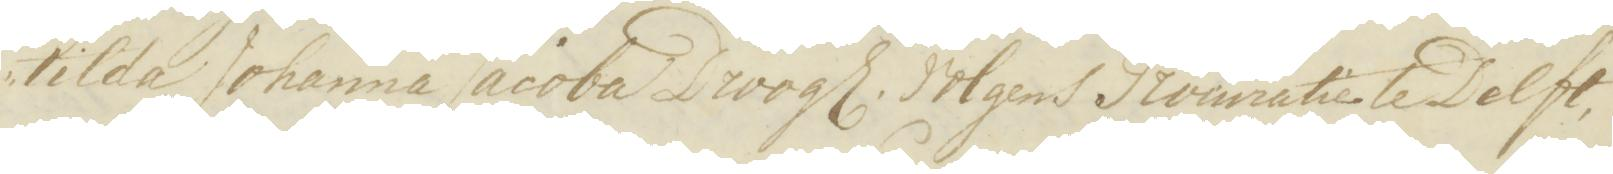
„tilda Johanna Jacoba Droogh: volgens Procuratie te Delft,
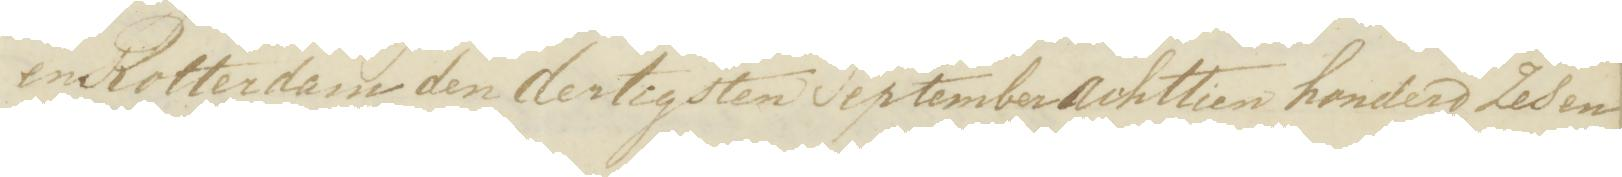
en Rotterdam den dertigsten September achttien honderd Zes en
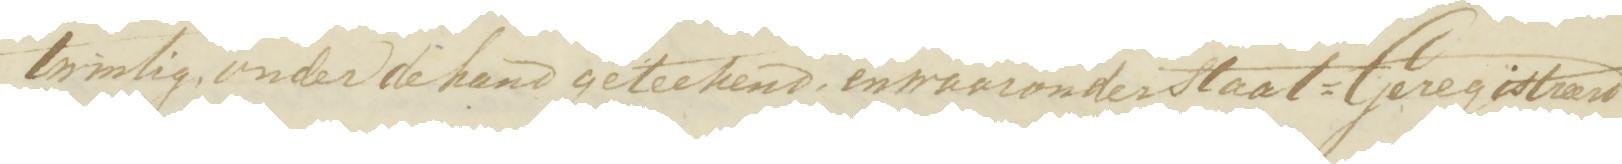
twintig onder de hand geteekend, en waaronder staat = Geregistreerd
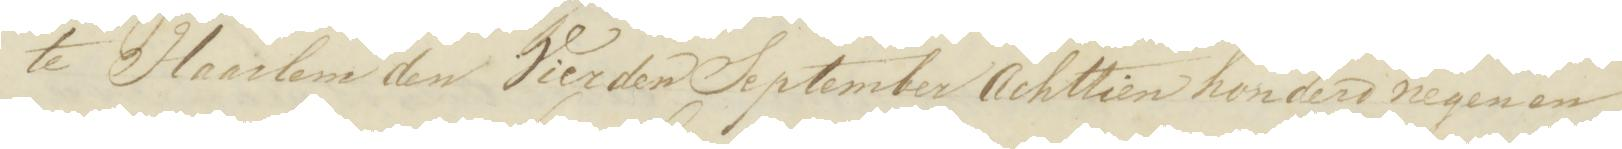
te Haarlem den Vierden September Achttien honderd negen en
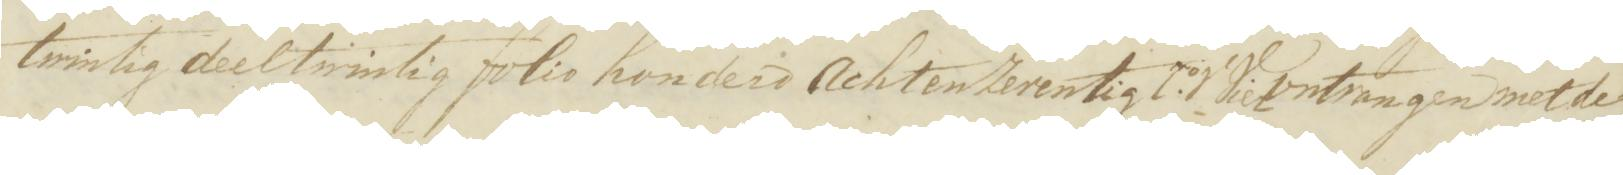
twintig deel twintig folio honderd achtenzeventig R.o V Vier ontvangen met de
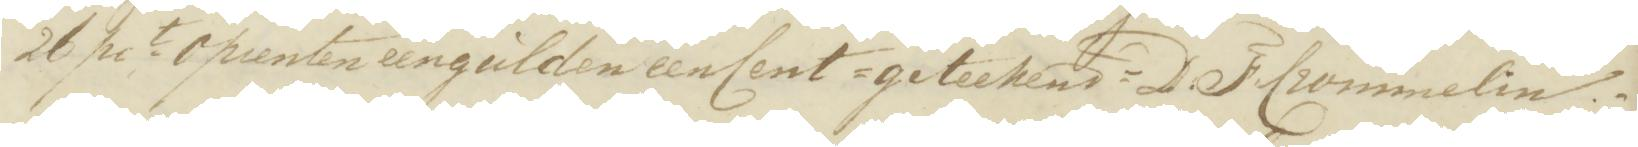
26 pc=t opcenten een gulden een Cent = geteekend = D.F. Crommelin.
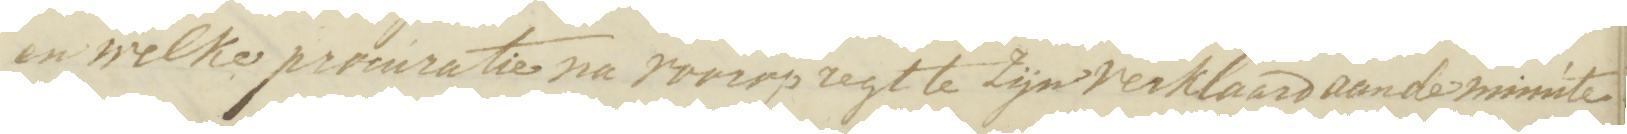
en welke procuratie na voorop regt te zijn verklaard aan de minute
